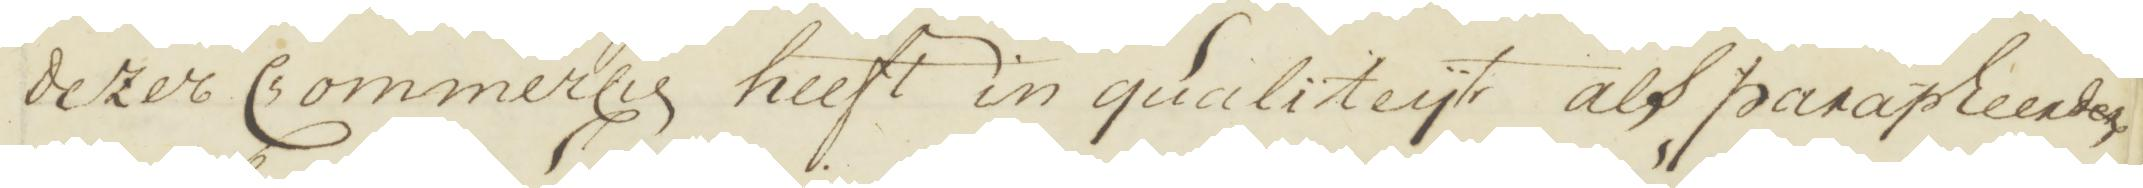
dezer commercie heeft en qualiteijt als parapheerden
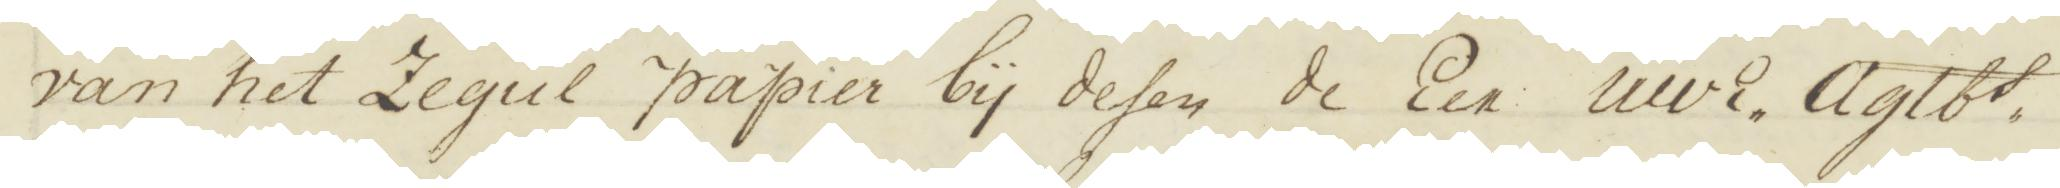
van het Zegul papier bij desen de Eer uw E„ Agtb„s
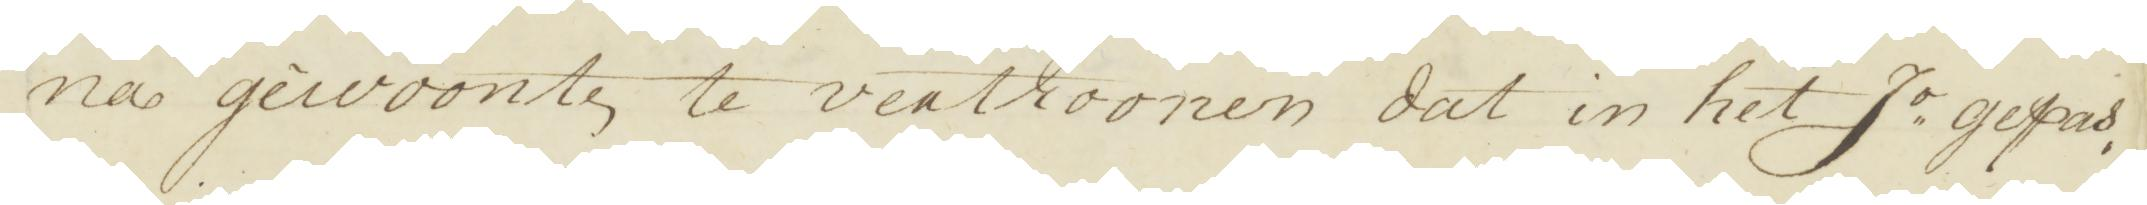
na gewoonte te verthoonen dat in het J„o gepas„
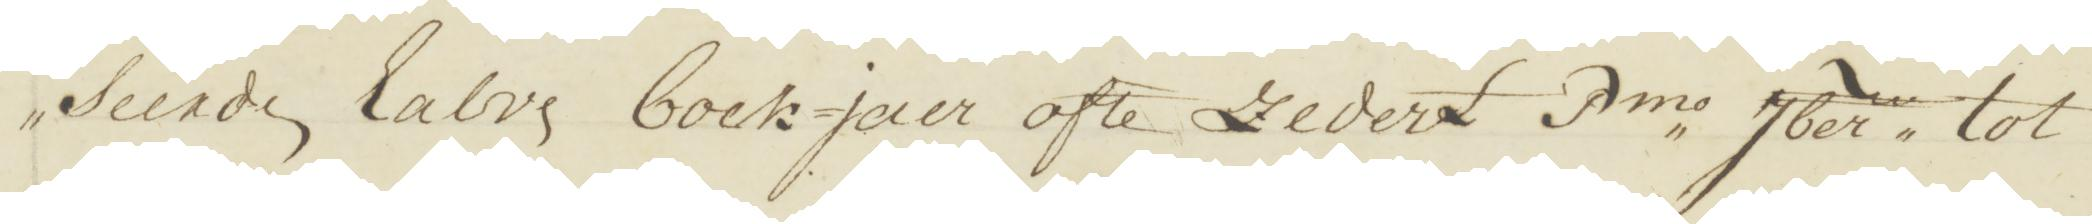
seerden halven boek=jaer ofte zedert P„mo 7ber„ tot
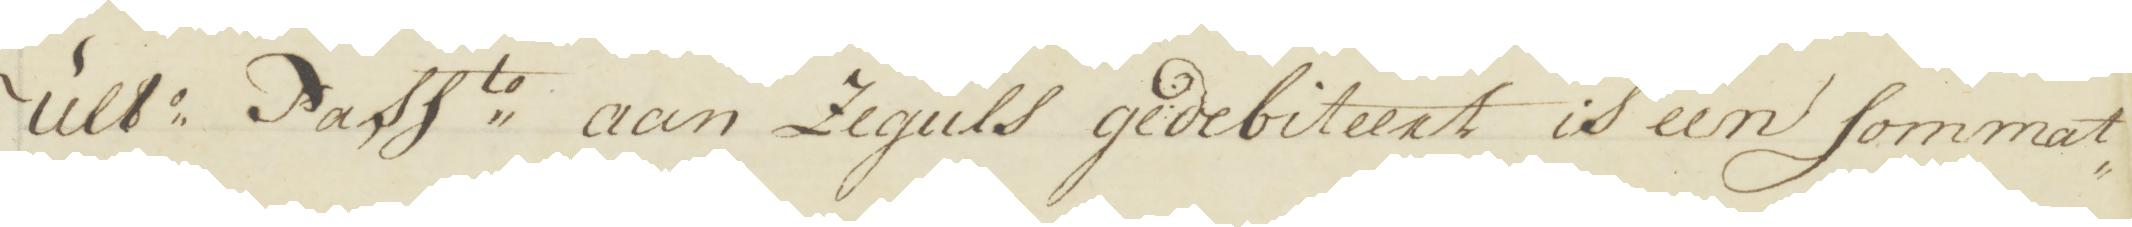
ult„o pass„to aan Zeguls gedebiteert is een sommat„
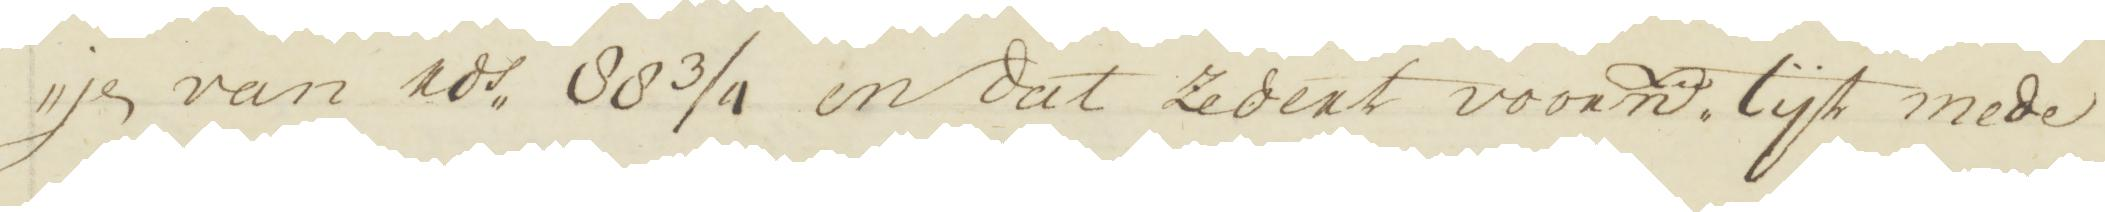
„jen van rd„s 88¾ en dat zedert voorn: tijt mede
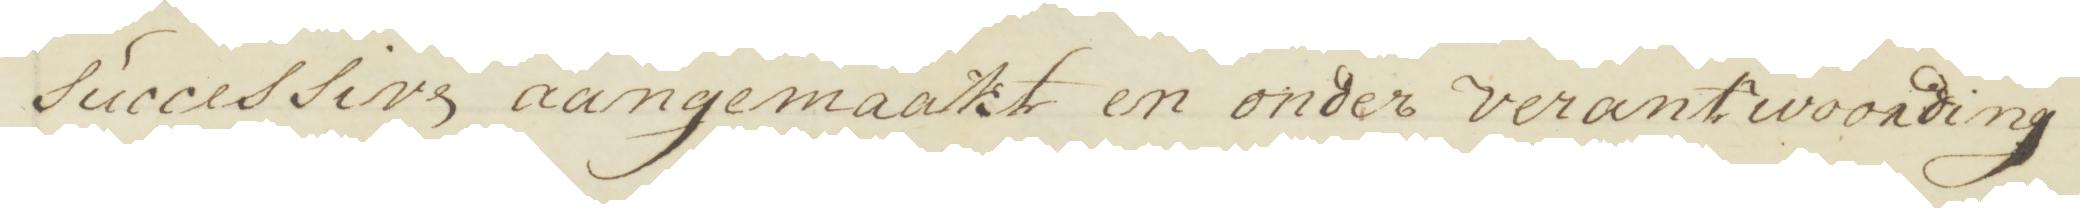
successiven aangemaakt en onder verantwoording
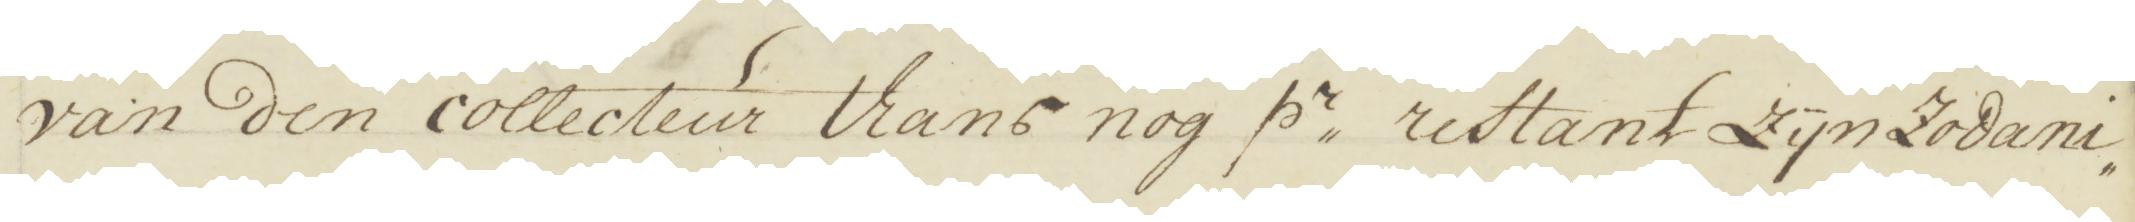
van den collecteur thans nog p„r restant zijn zodani„
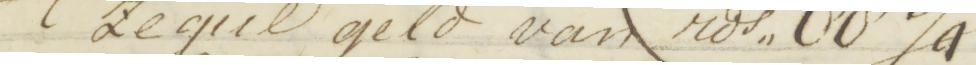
’t zegul geld van rds„ 88¾
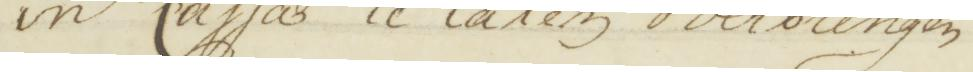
in Cassa te laten overbrengen
